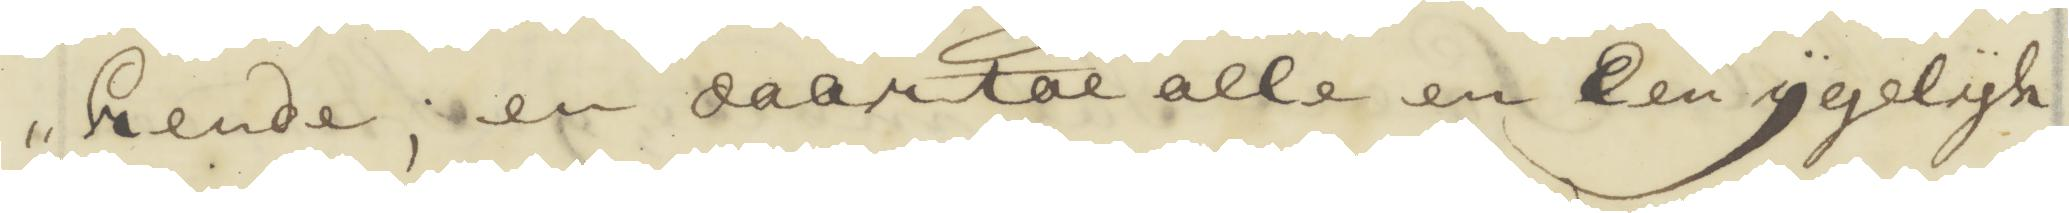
„kende; en daar toe alle en Een ijgelijk
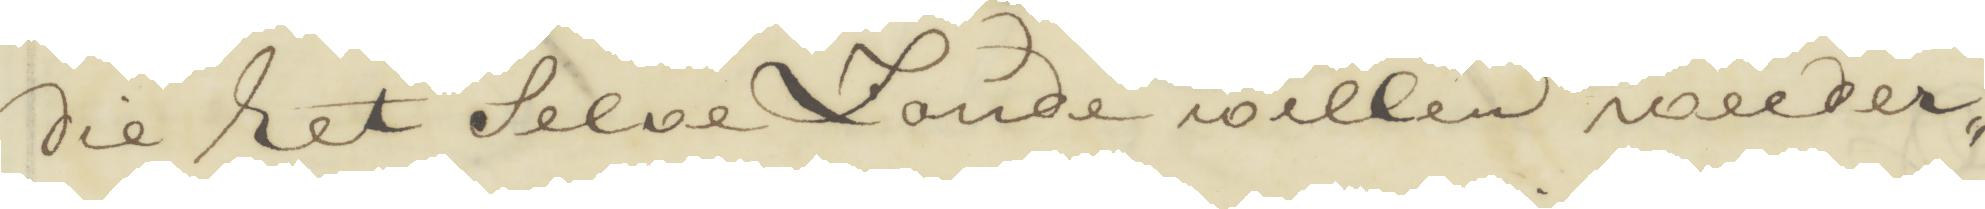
die het selve zoude willen weeder„
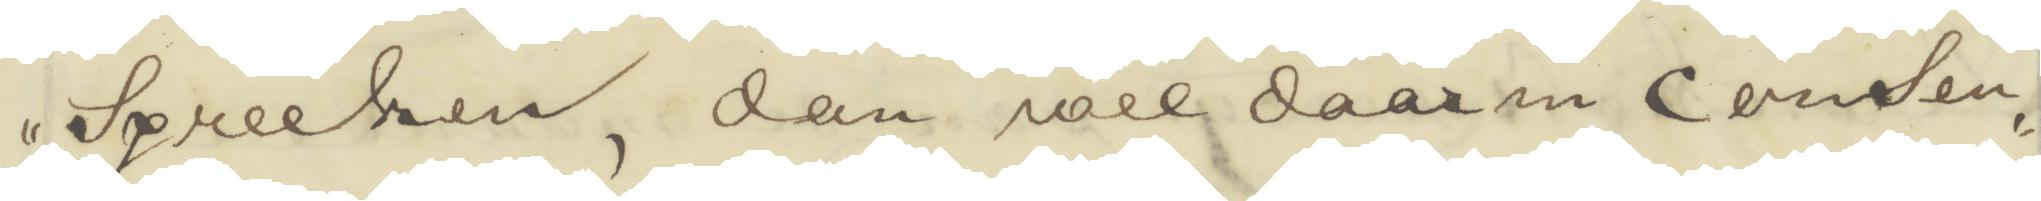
„spreeken, dan wel daar in Consen„
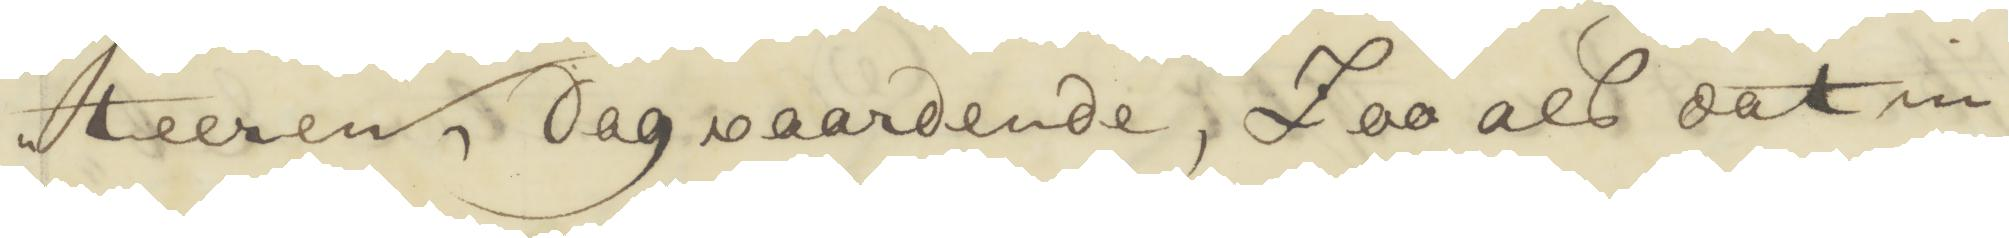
„teeren, dag vaardende, zoo als dat in
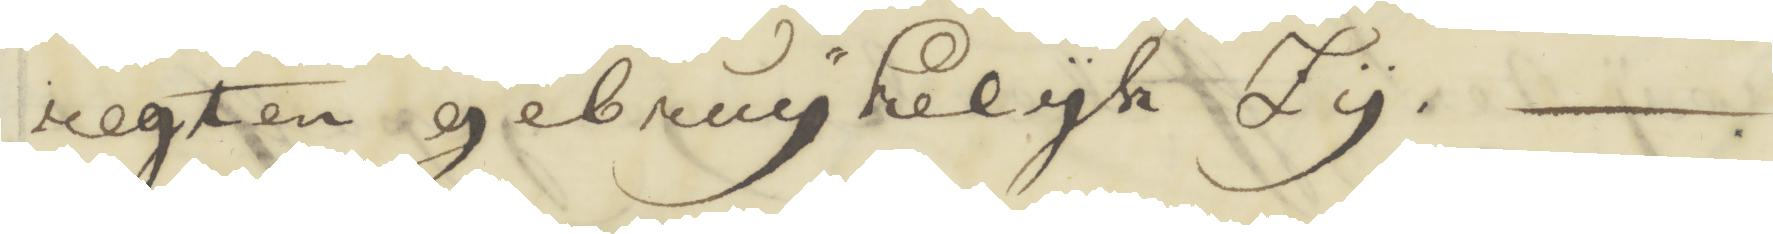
regten gebruijkelijk zij. —
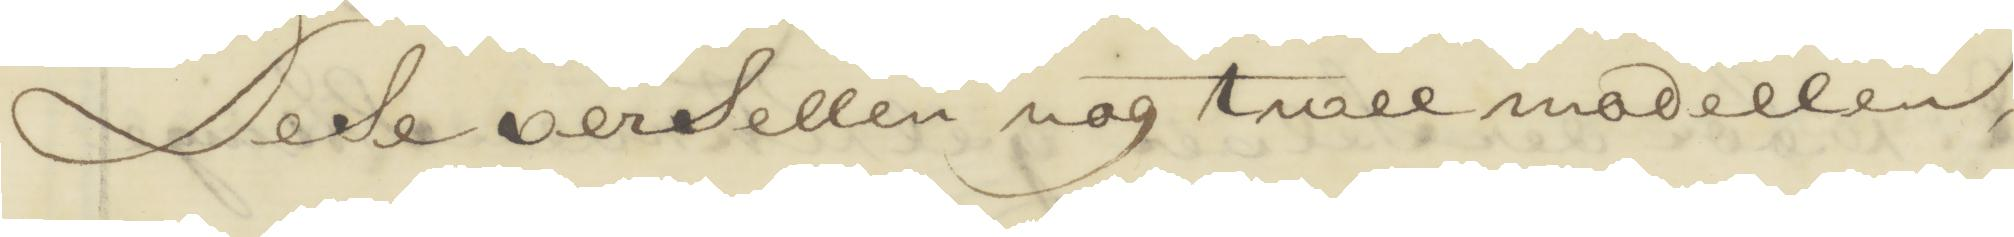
Dese versellen nog twee modellen,
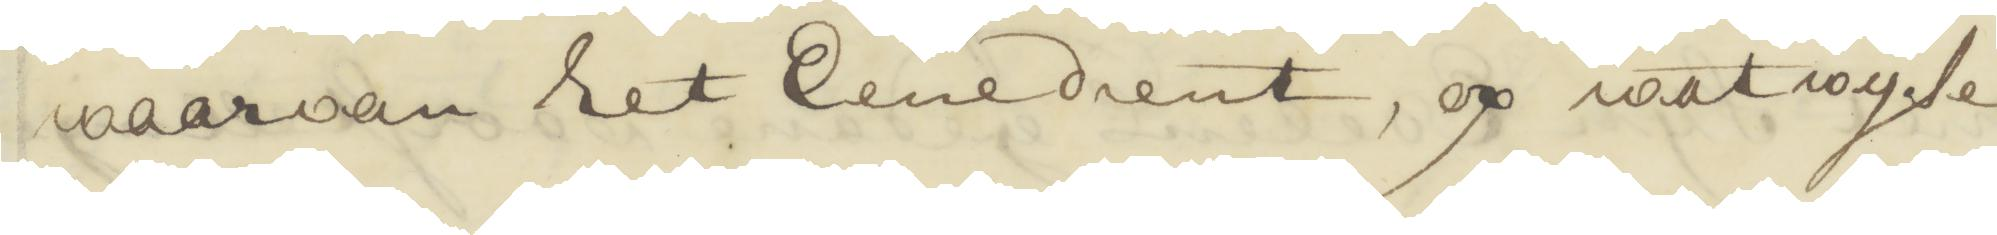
waarvan het Eene dient, op wat wijse
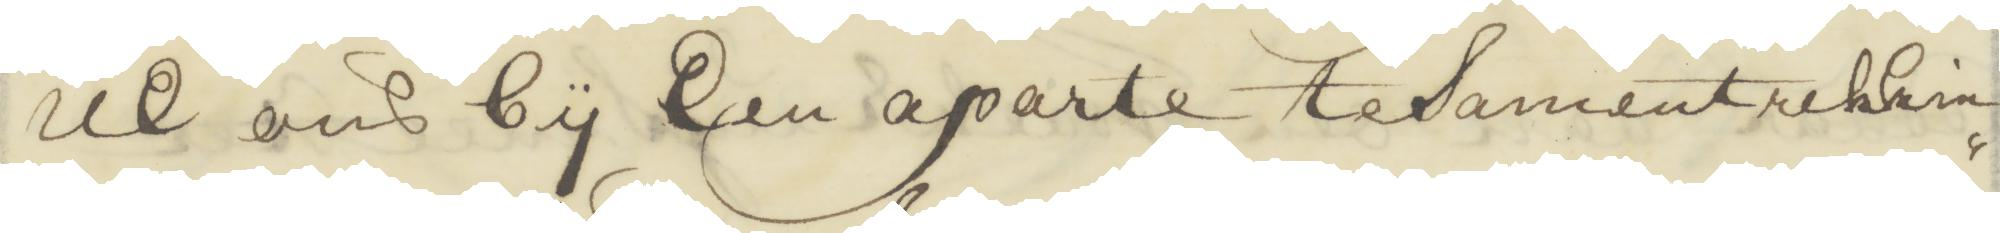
uE ons bij Een aparte tesamentrekkin„
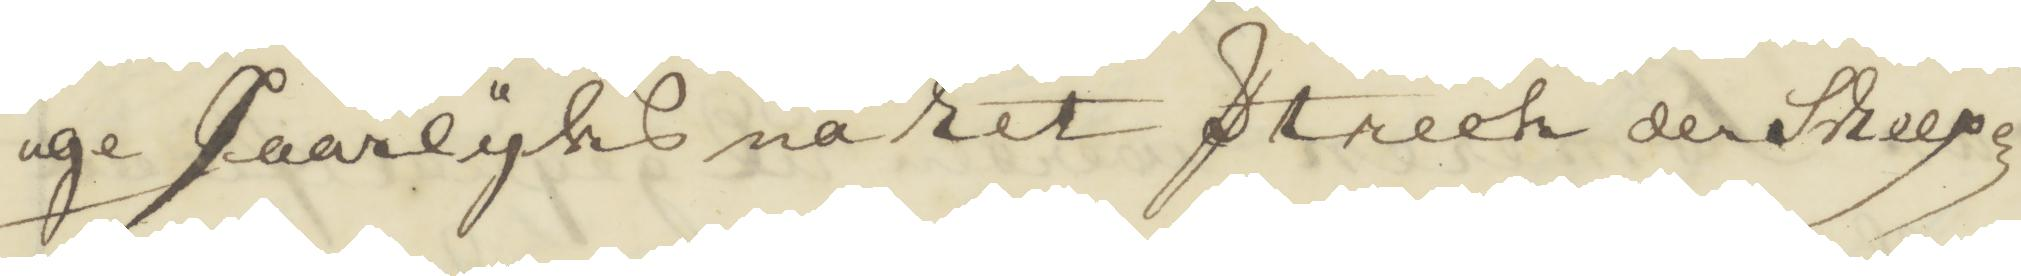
ge Jaarlijks na het vertreck der scheepen
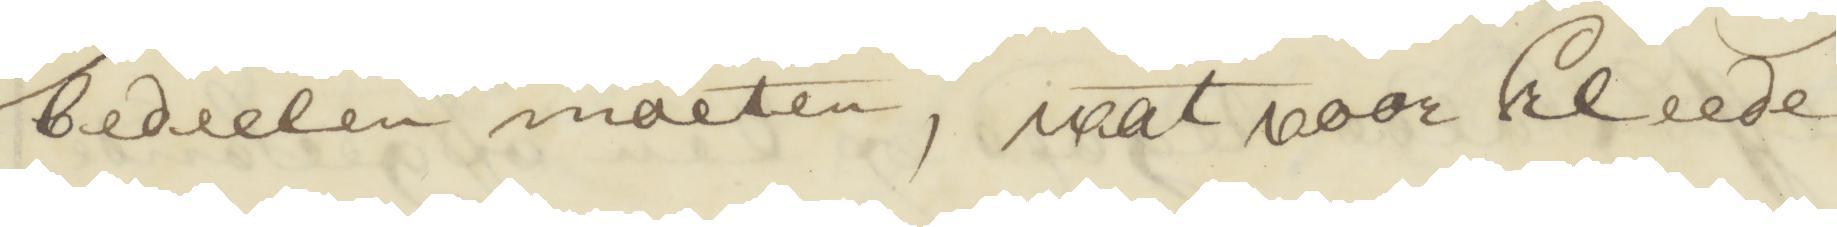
bedeelen moeten, wat voor kleede
